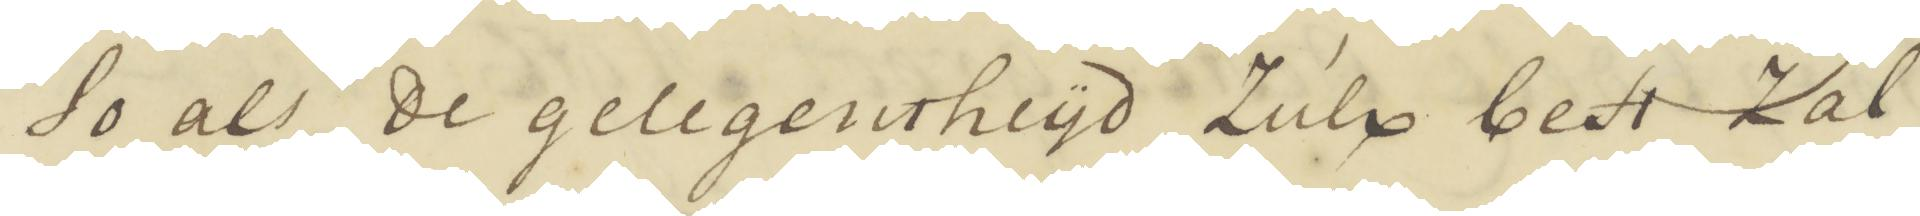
so als de gelegentheijd zulx best zal
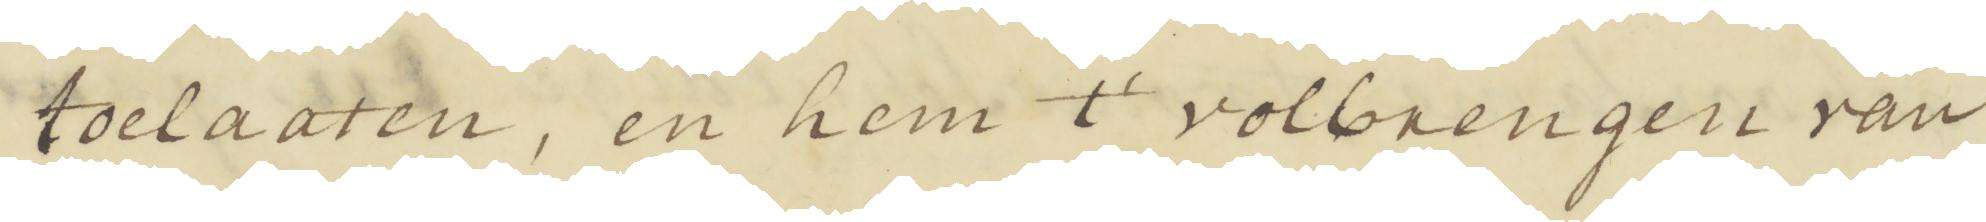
toelaaten, en hem t' volbrengen van
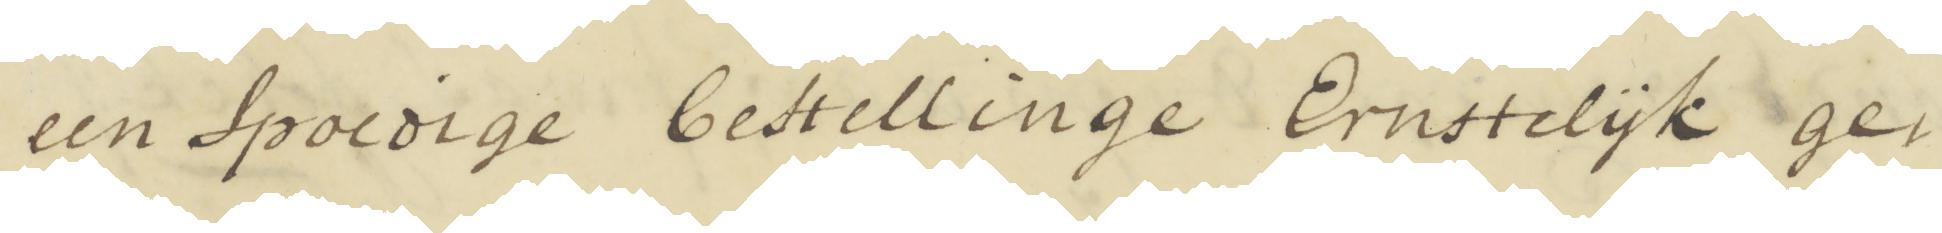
een spoedige bestellinge Ernstelijk ge
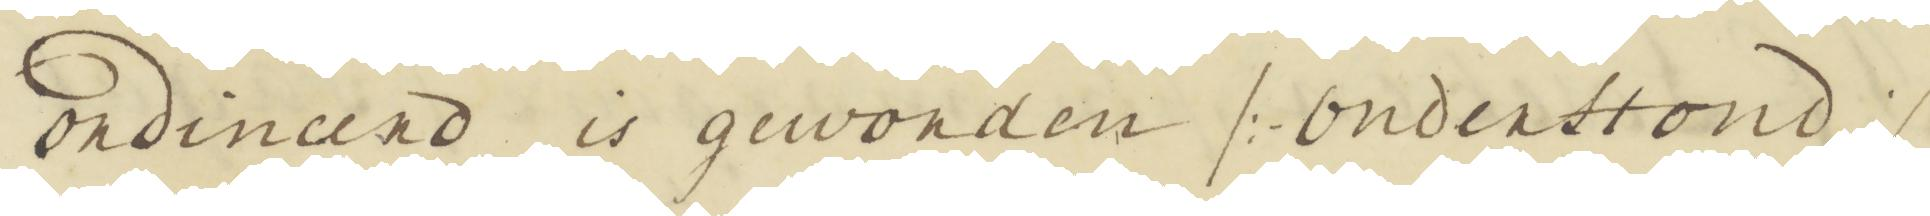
ordineerd is geworden /:onderstond :/
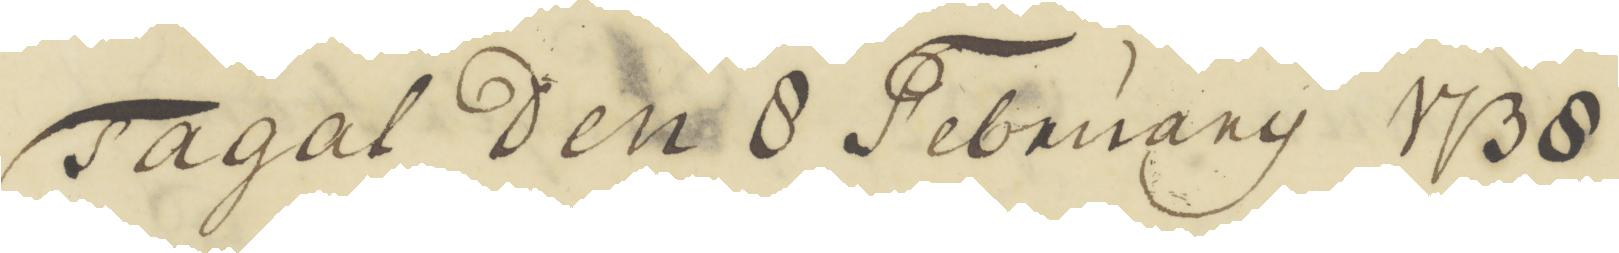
Tagal den 8 Februarij 1738
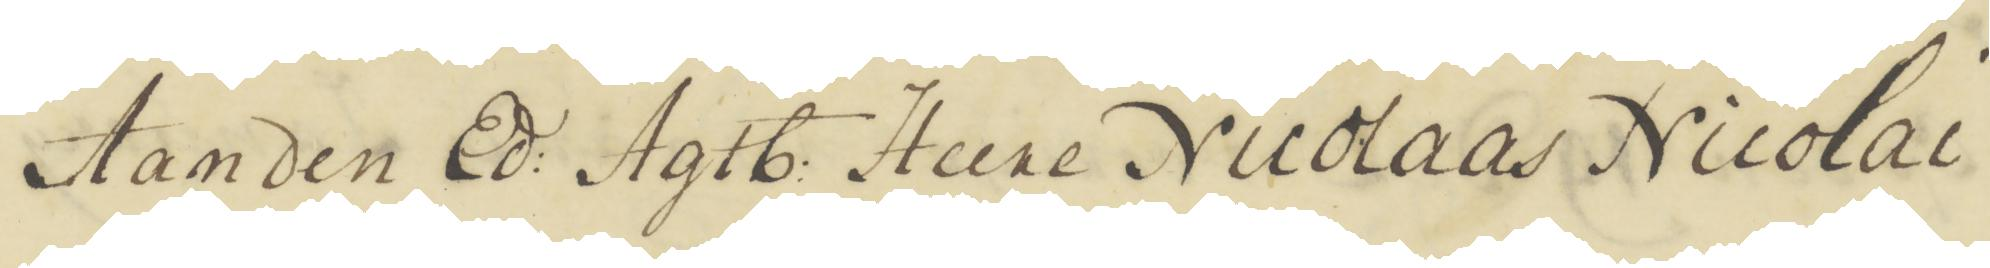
Aan den Ed: Agtb: Heere Nicolaas Nicolai
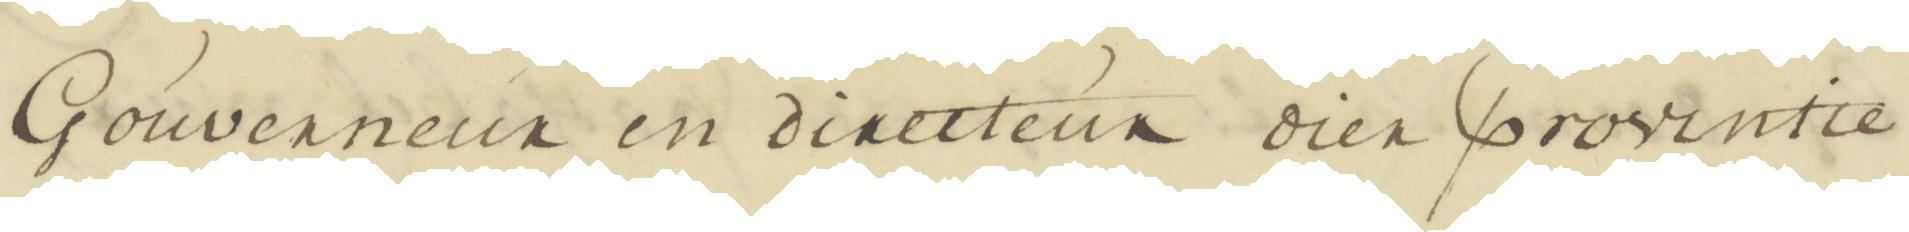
Gouverneur en directeur dier proventie
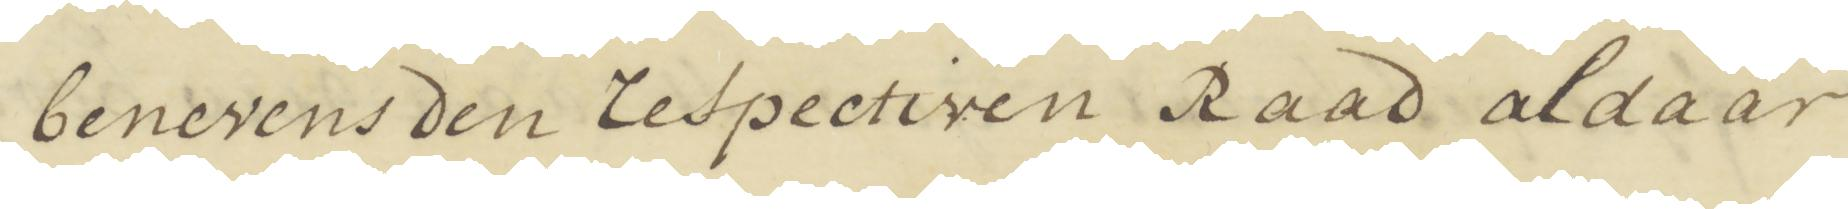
benevens den respectiven Raad aldaar
